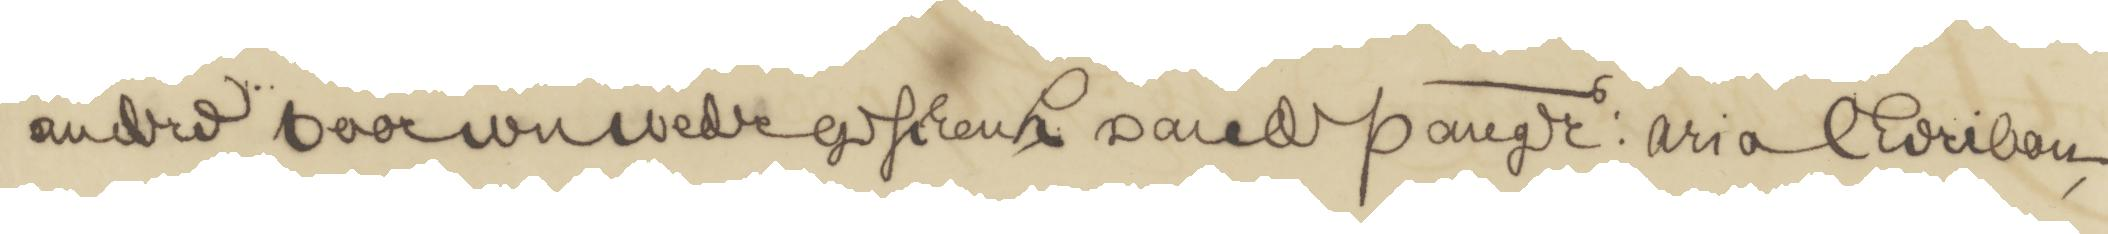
andere voor een weder geschenk vande panger:s aria Cheribon,
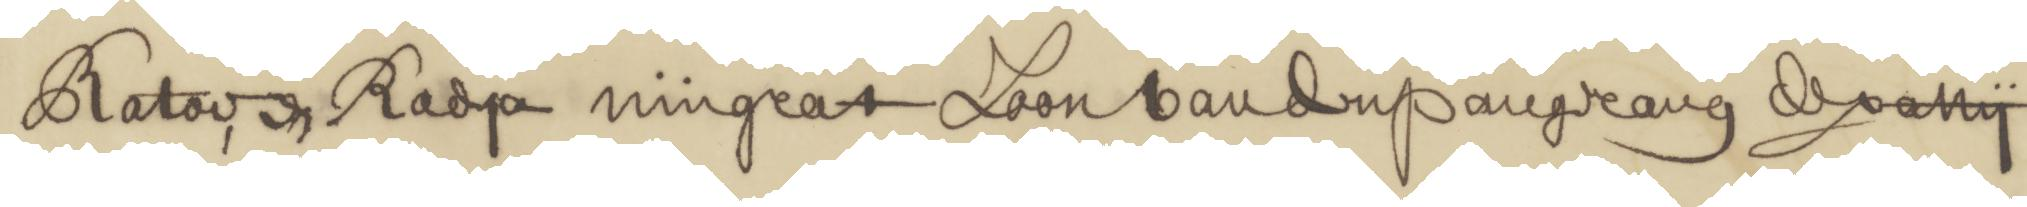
Ratoe, en Radja ningrat zoon van den pangelang depattij
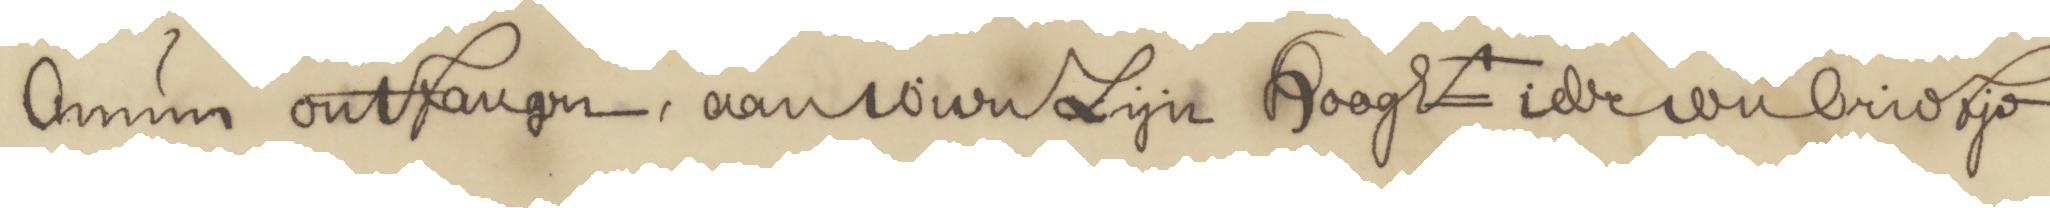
Omun ontfangen, aan wien zijn Hoogh=t ider een briefje
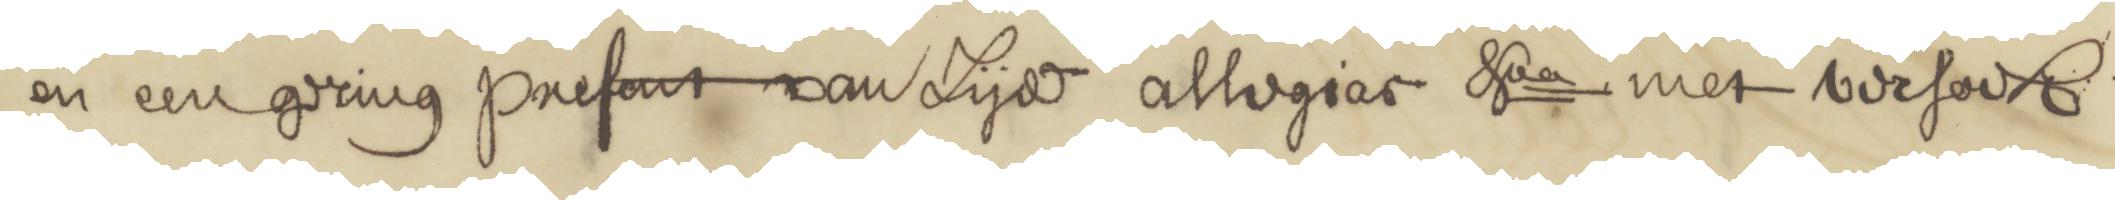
en een gering present van zijde allegias eraan met versoek
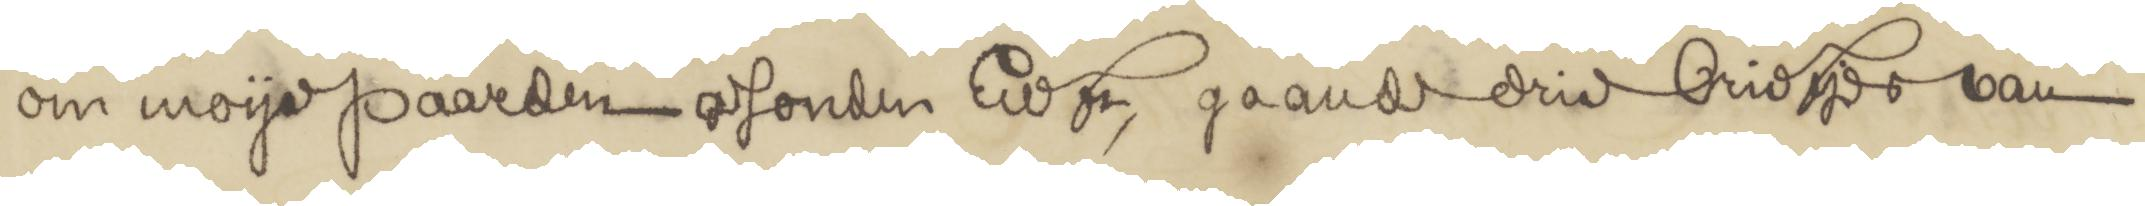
om moije paarden gesonden heeft, gaande drie briefjes van
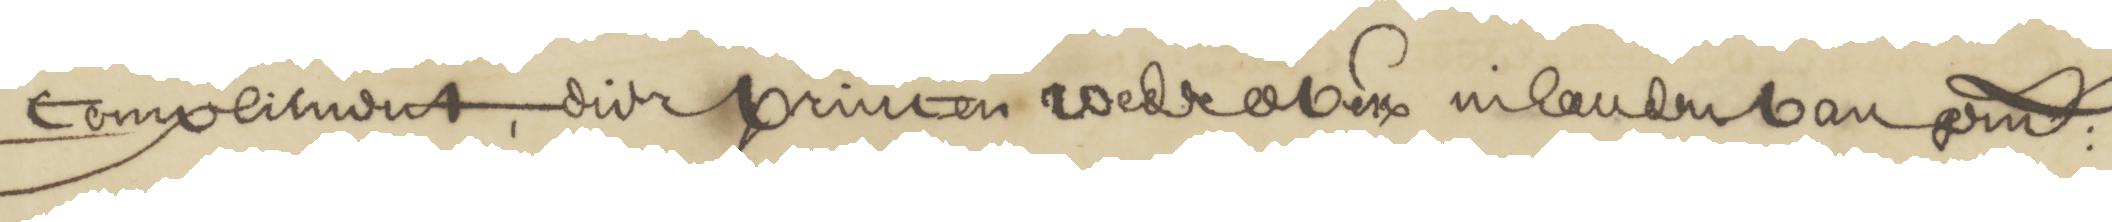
compliment, dier princen weder over inhanden van gem:
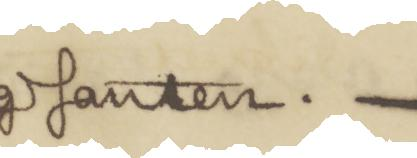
gesanten. —
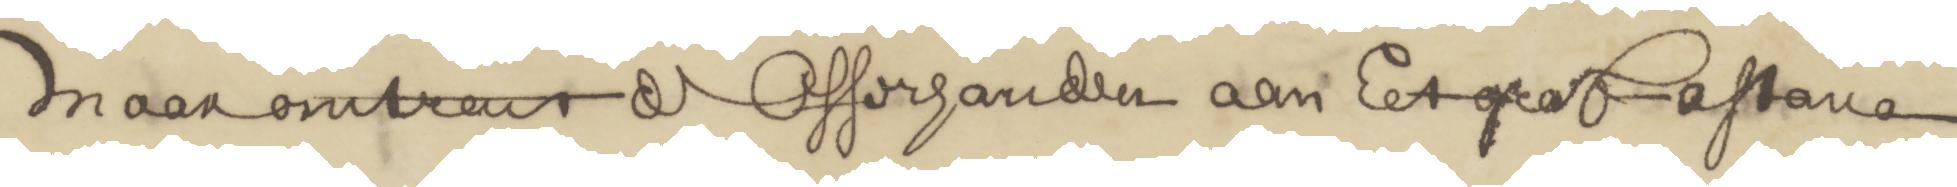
Maar omtrent de Offerhanden aan het graf astana
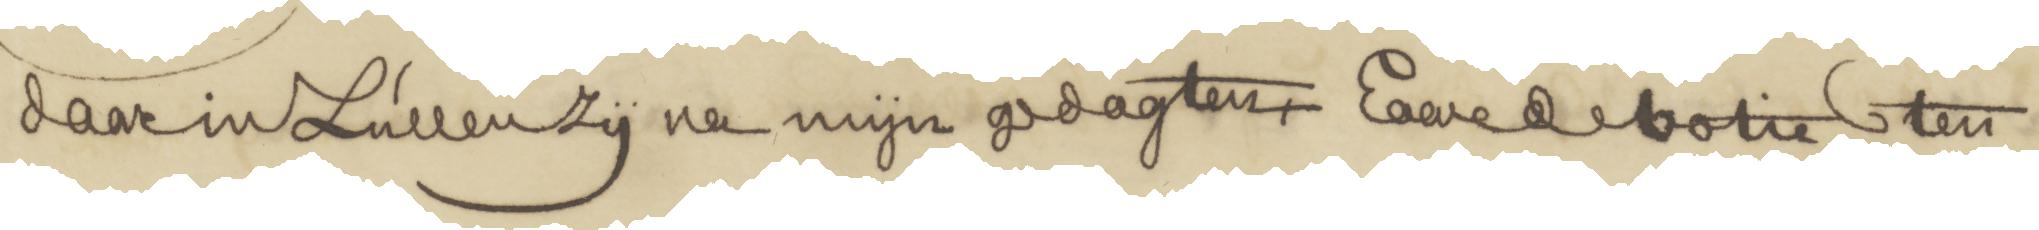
daar in zullen zij na mijn gedagten, haare devotie ten
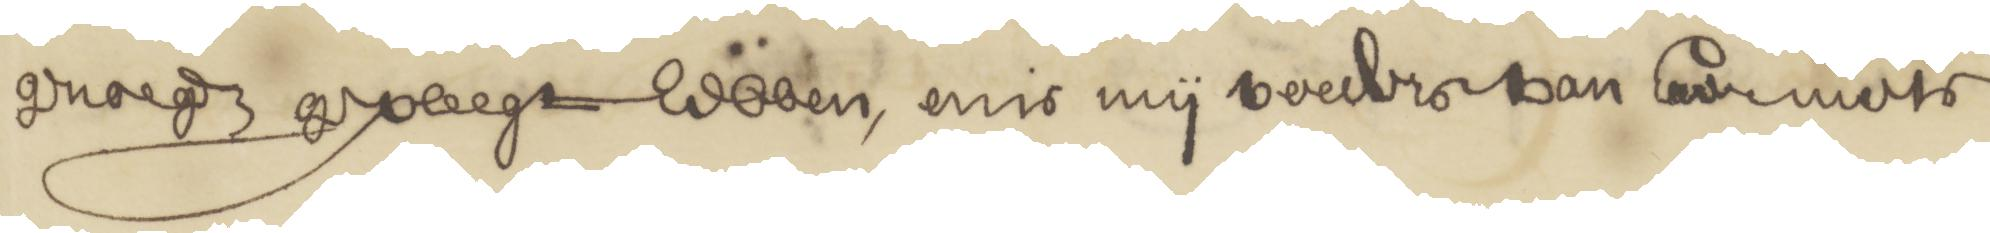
genoegen gepleegt hebben, enis mij verders van haer niets
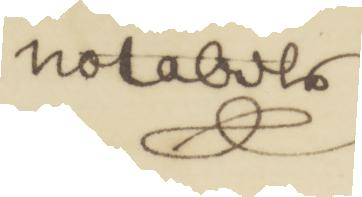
notabels
